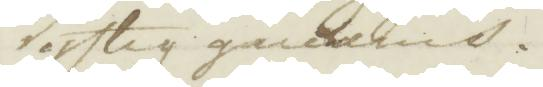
Vyftig guldens.
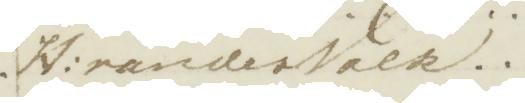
H: van der Valk. .
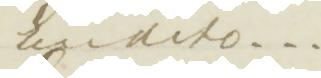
Een dito . . .
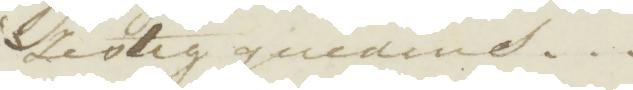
Zestig guldens . . . .
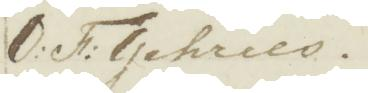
O: F: Gehrels.
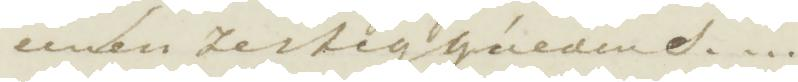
een en zestig guldens . . . .
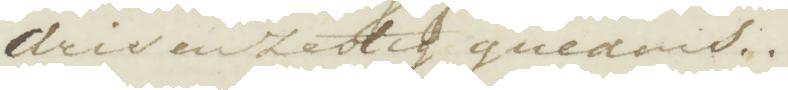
drie en zestig guldens.
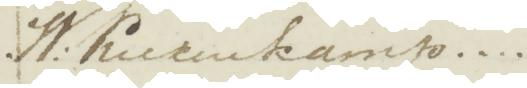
W: Kiekenkamp. ..
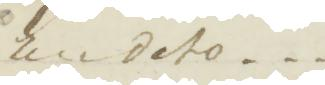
Een dito. .. .
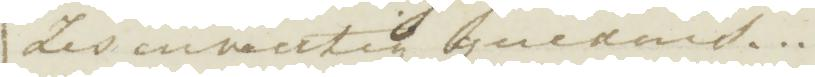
Zes en veertig Guldens. .
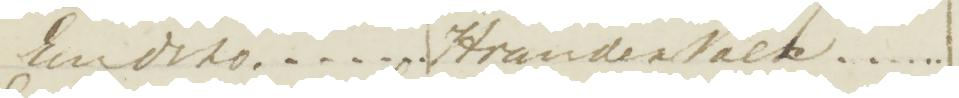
Een dito . . . . . H vander Valk . . . . .
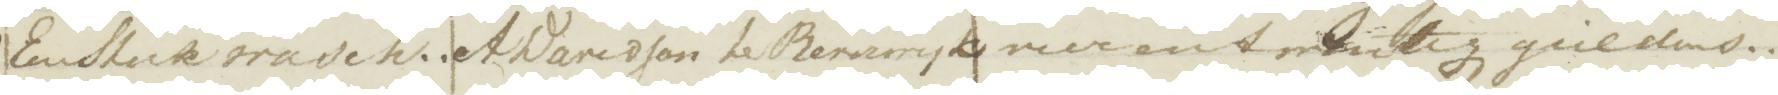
Een stuk wasch A Davidson te Beverwijk vier en twintig guldens. .
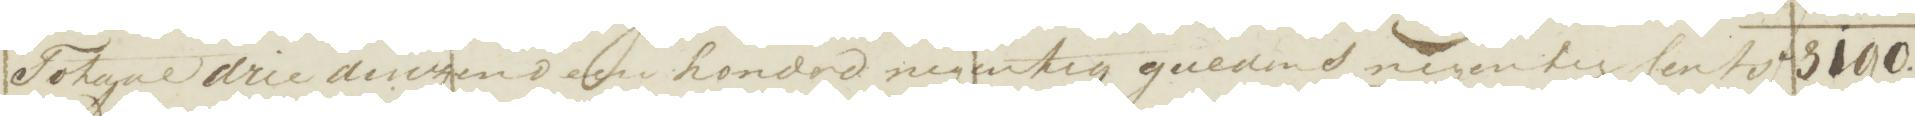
Fotane drie duzend en honderd negentig guldens negentig Cents 3190.
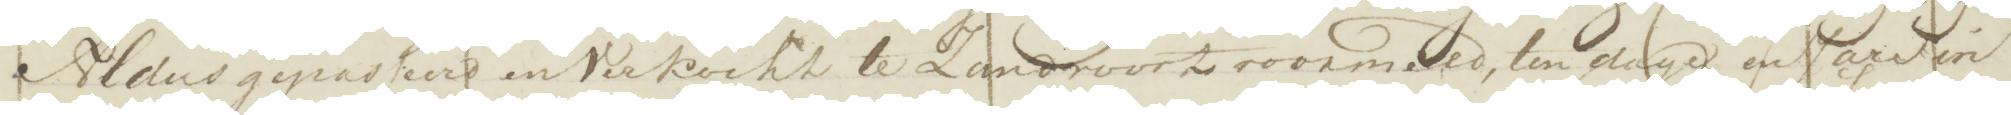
Aldus gepasseerd en Verkocht te Zandvoort voormeld, ten dage en Jare in
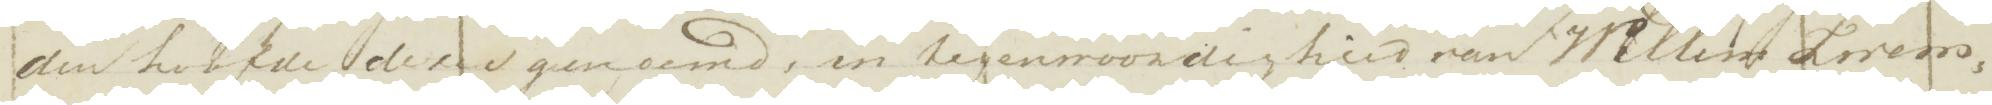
den hoofde dezes genoemd, in tegenwoordigheid van Willem Zwem„
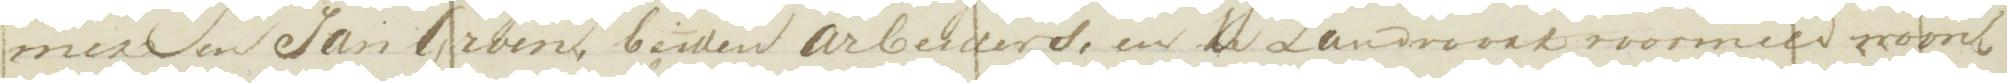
mer en Ian Groen, beiden arbeiders, en te Zandvoort voormeld woon
